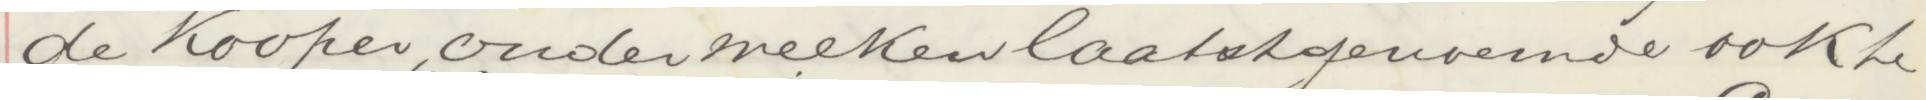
de Kooper, onder welken laatstgenoemde ook te
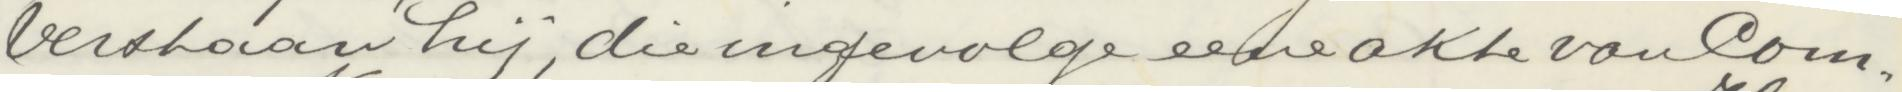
verstaan hij, die ingevolge eene akte van Com„
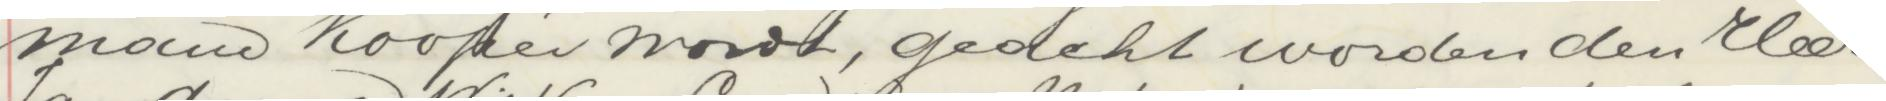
mand kooper worde, geacht worden den Heer
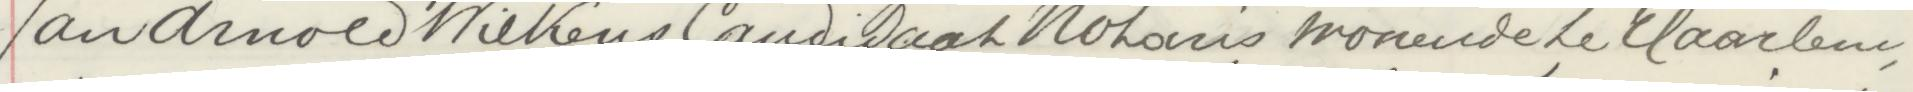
Jan Arnold Wilkens, Candidaat Notaris wonende te Haarlem,
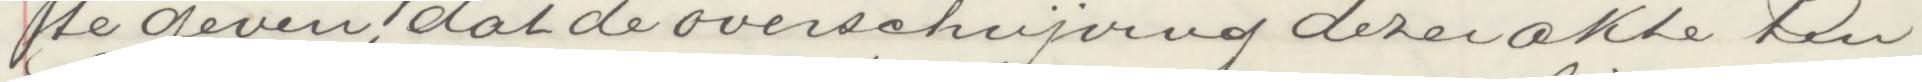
te geven, dat de overschrijving dezer akte ten
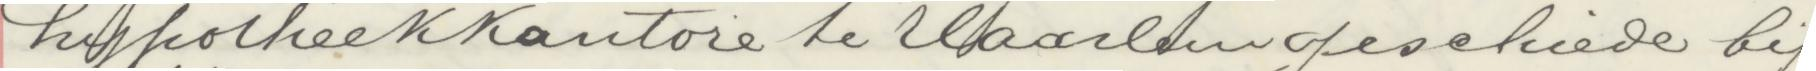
hypotheekkantore te Haarlem geschiede bij
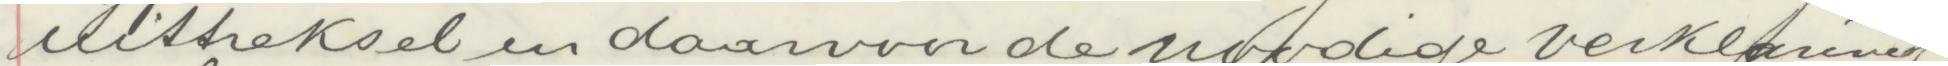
uittreksel en daarvoor de noodige verklaring
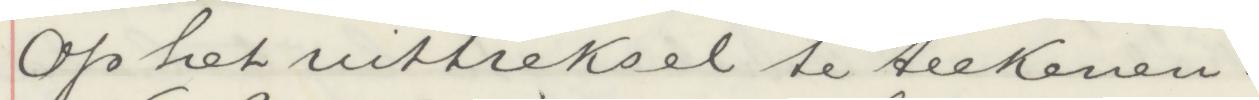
Op het uittreksel te teekenen.
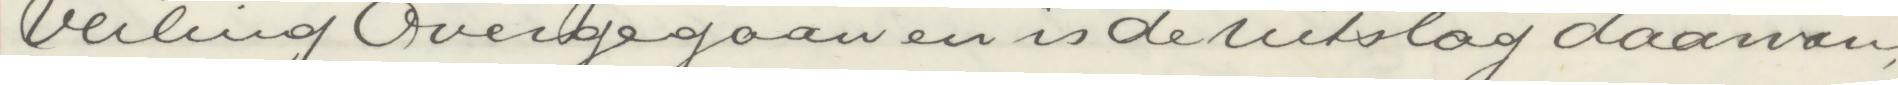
veiling Overgegaan en is de uitslag daarvan,
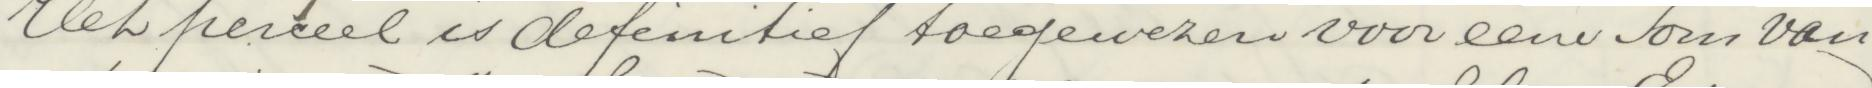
Het perceel is definitief toegewezen voor eene som van
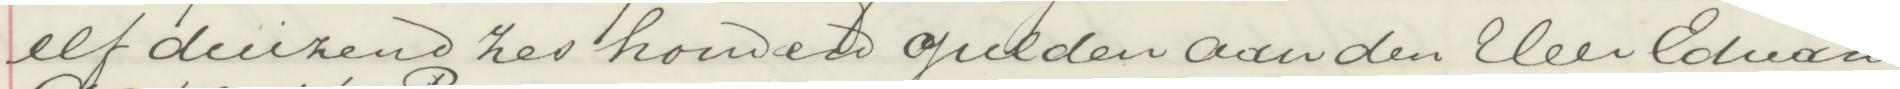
elf duizend zes honderd gelden aan den Heer Eduard
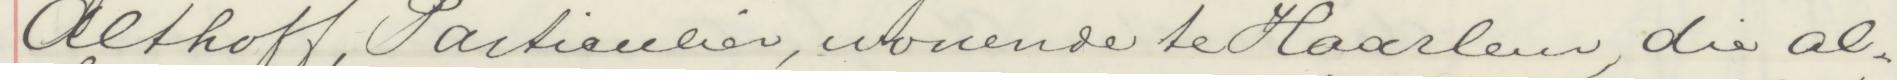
Althoff, Particulier, wonende te Haarlem, die al„
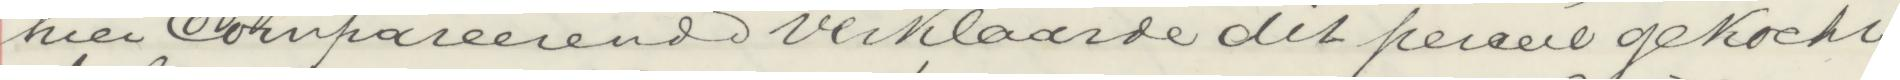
hier compareerende verklaarde dit perceel gekocht
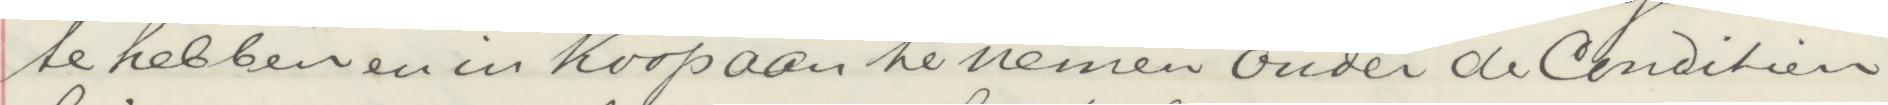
te hebben en in koop aan te nemen onder de Conditien
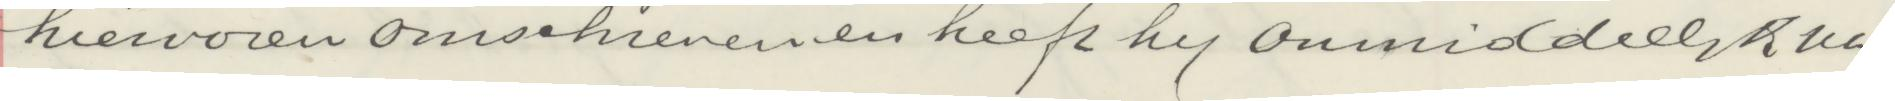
hiervoren omschreven en heeft hy onmiddellyk na
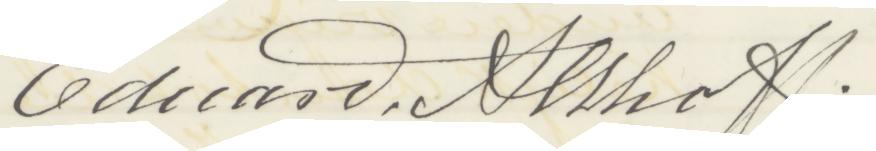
Eduard, Althoff.
